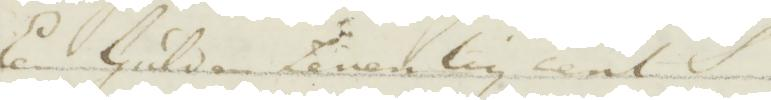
Een Gulden Zeventig cents
